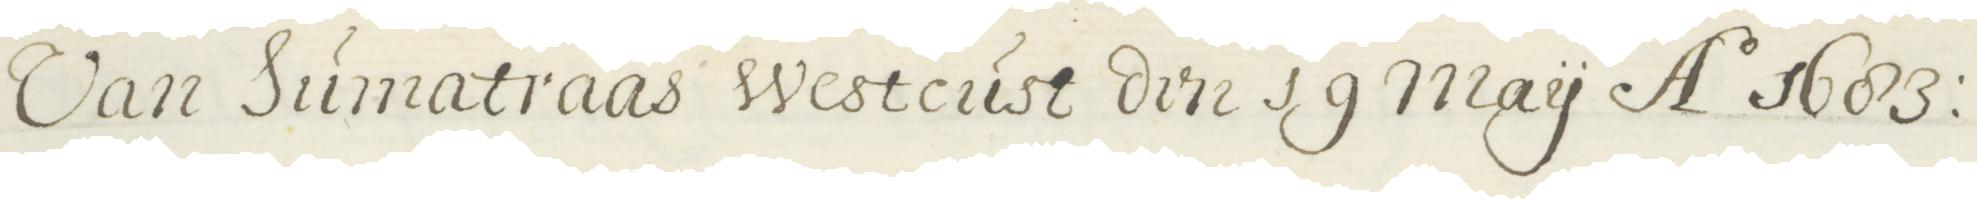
Van Sumatraas Westcust den 19 Maij Ao 1683:
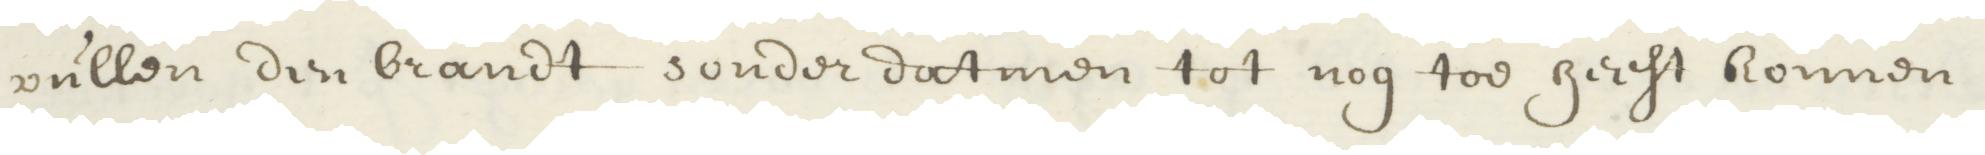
vullen den brandt sonder dat men tot nog toe heeft konnen
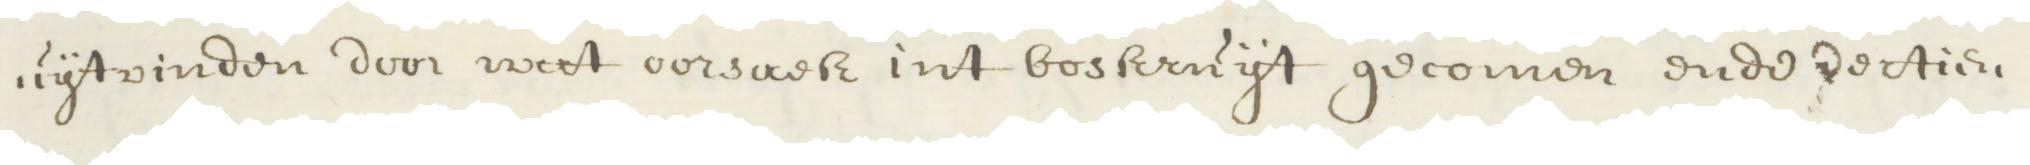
uijtvinden door wat oorsaek int boskruijt gecomen ende dertien
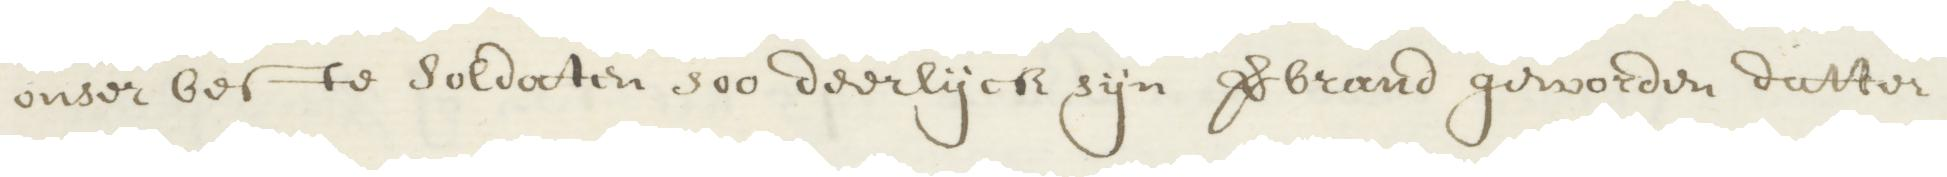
onser beste soldaten soo deerlijck sijn verbrand geworden datter
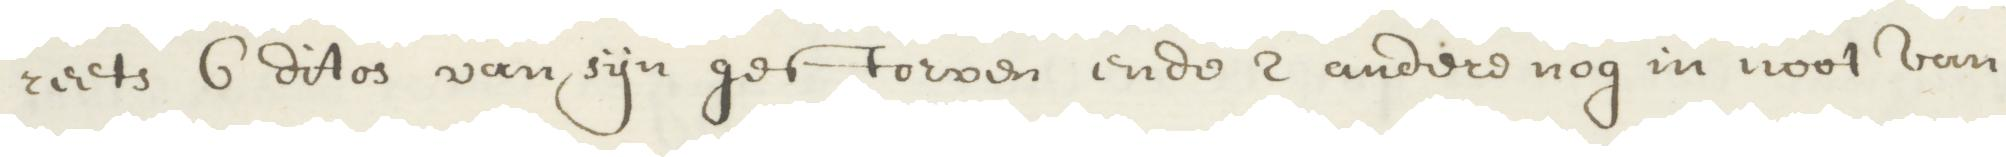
reets 6 ditos van sijn gestorven ende 2 andere nog in noot van
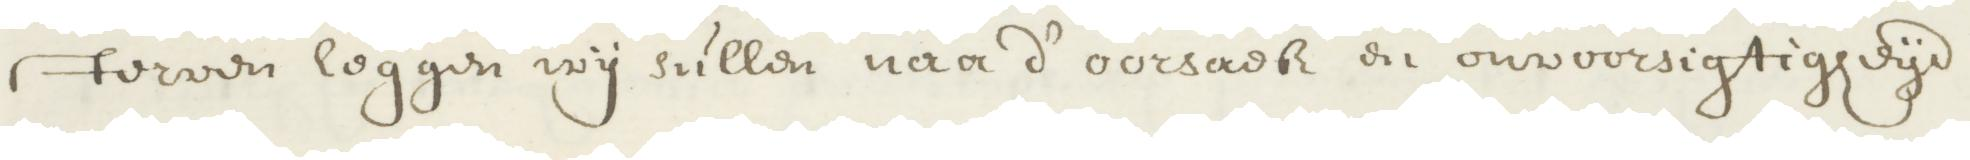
sterven leggen wij sullen naa d’ oorsaek en onvoorsigtigheijd
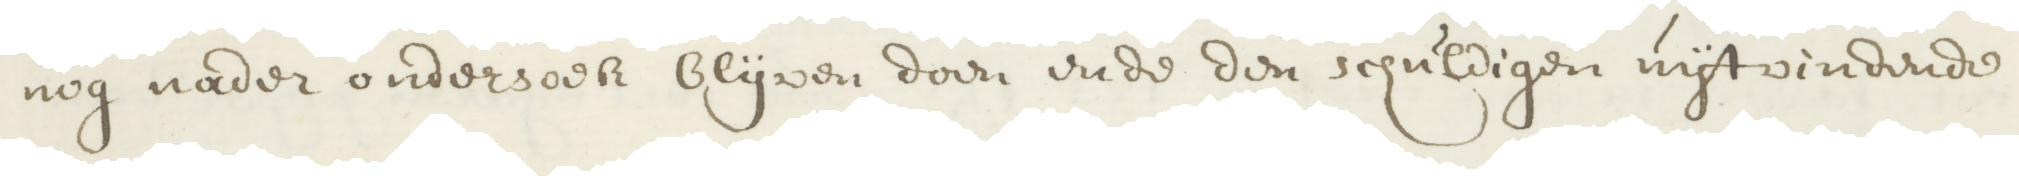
nog nader ondersoek blijven doen ende den schuldigen uijtvindende
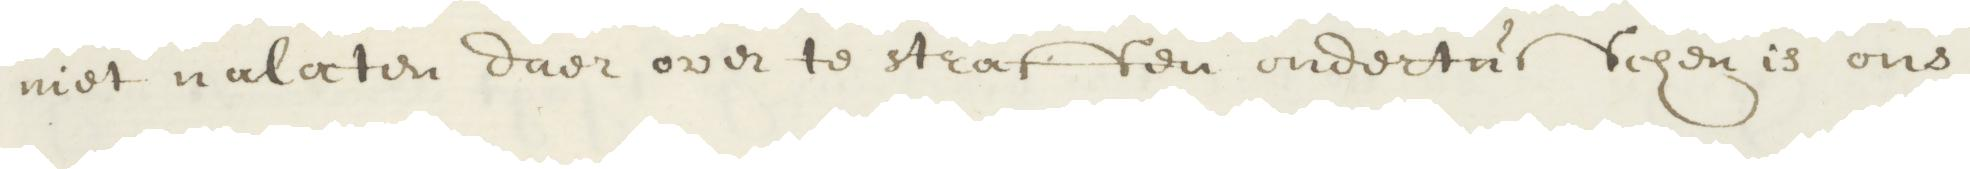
niet nalaten daer over te straffen ondertusschen is ons
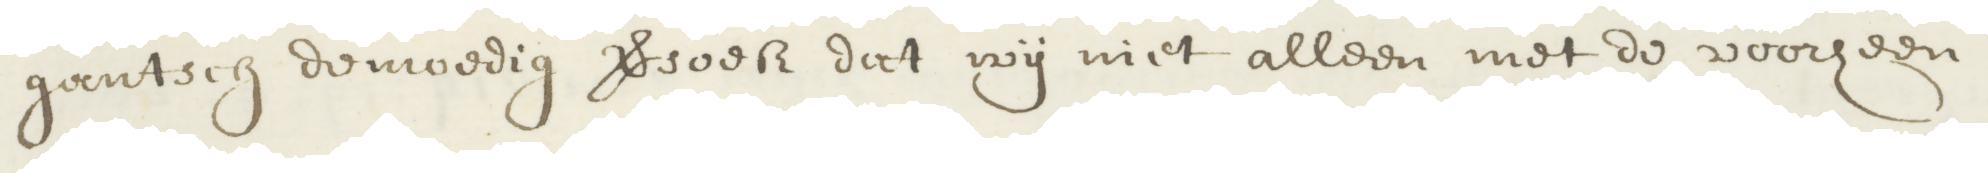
gantsch demoedig versoek dat wij niet alleen met de voorheen
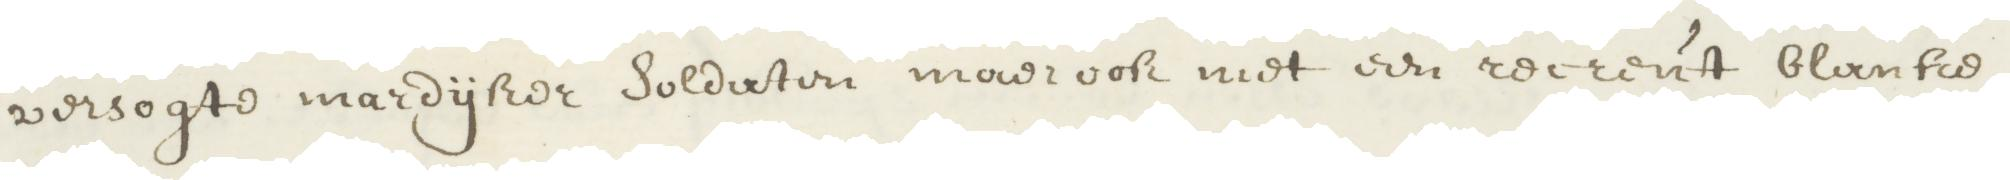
versogte mardijker soldaten maer ook met een recreut blanke
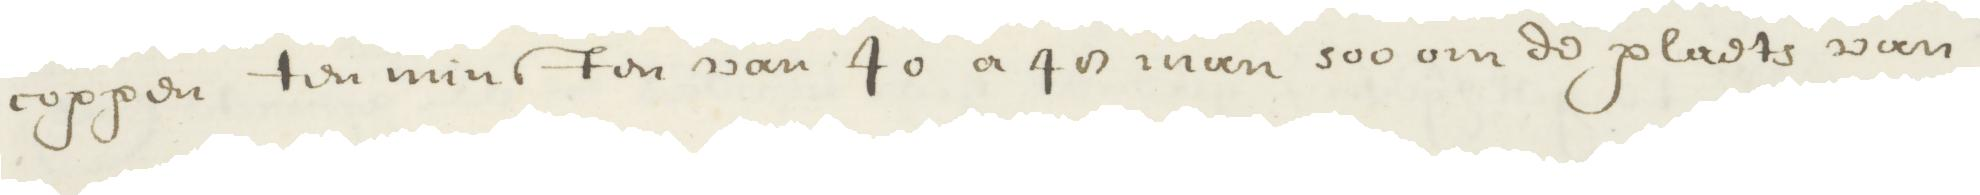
coppen ten minsten van 40 a 48 man soo om de plaets van
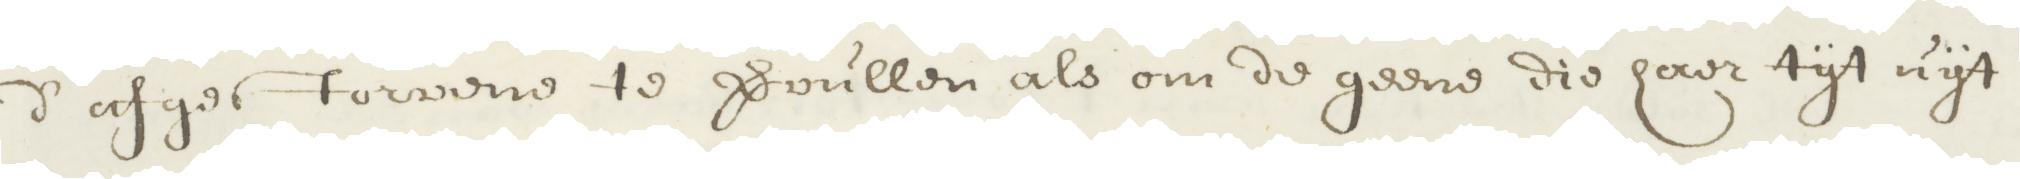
d’ afgestorvene te vervullen als om de geene die haer tijt uijt
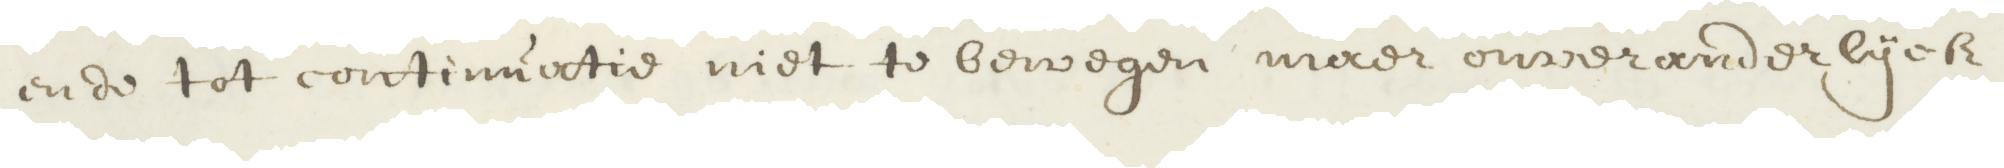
ende tot continuatie niet te bewegen maer onveranderlijck
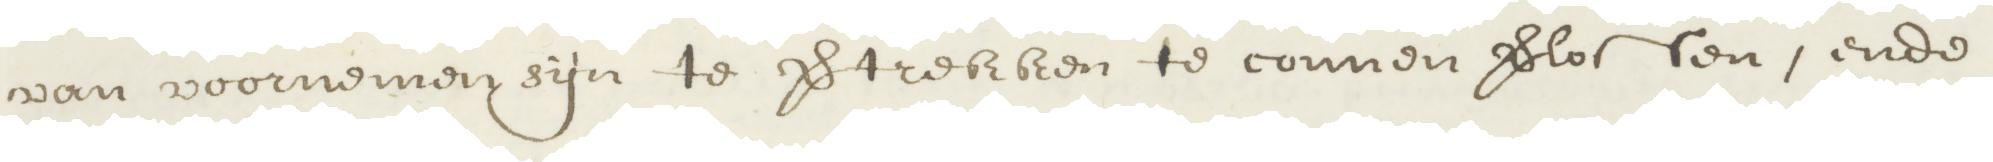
van voornemen sijn te vertrekken te connen verlossen, ende
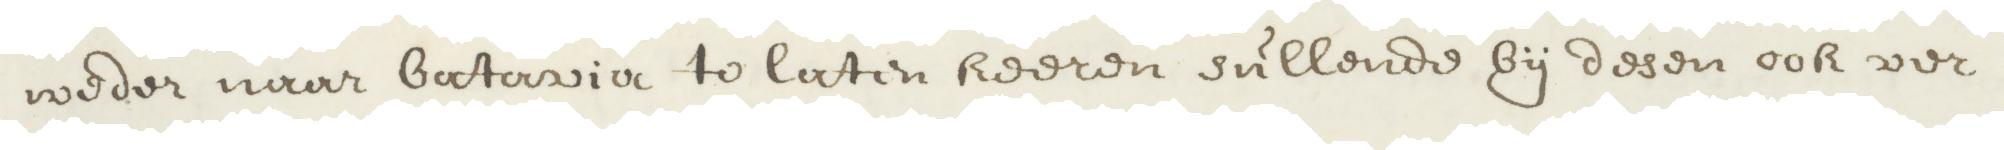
weder naar batavia te laten keeren sullende bij desen ook ver
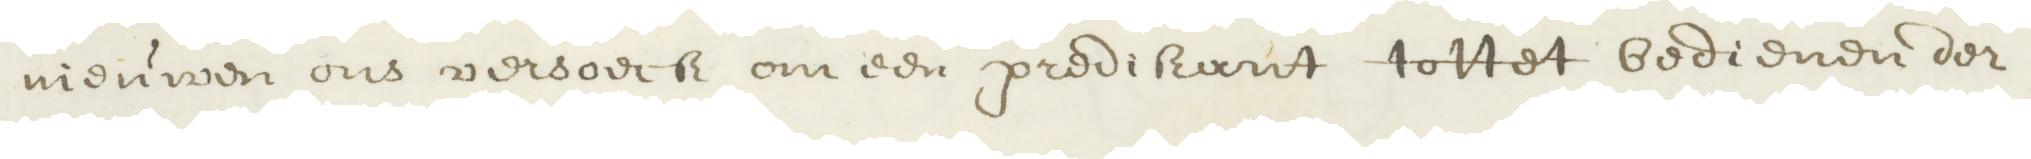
nieuwen ons versoeck om een predikant tottet bedienen der
